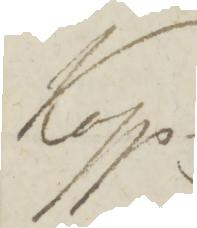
Kopp
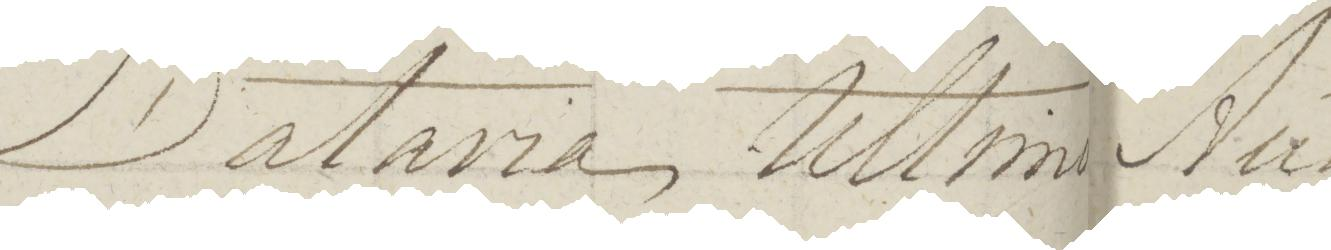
Batavia Ultimo Au
